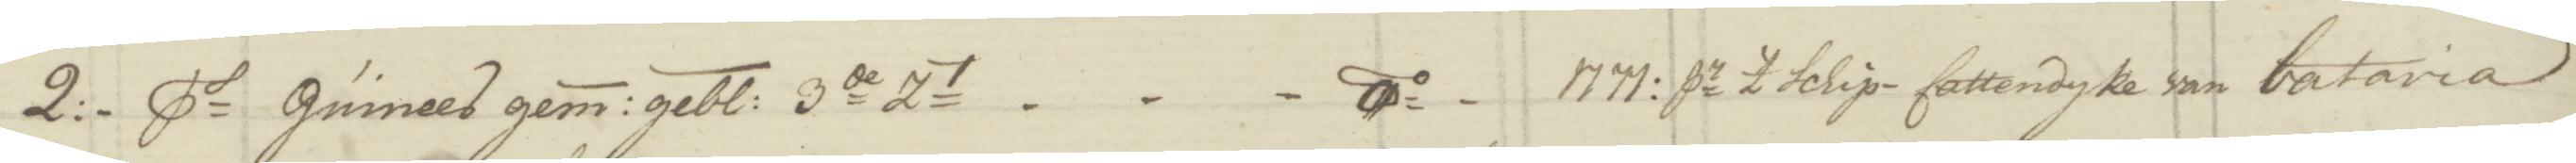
2:- p=s Guinees gem: gebl: 3=de z=t - - - A=o - 1771: p=r ’t schip- Cattendyke van batavia
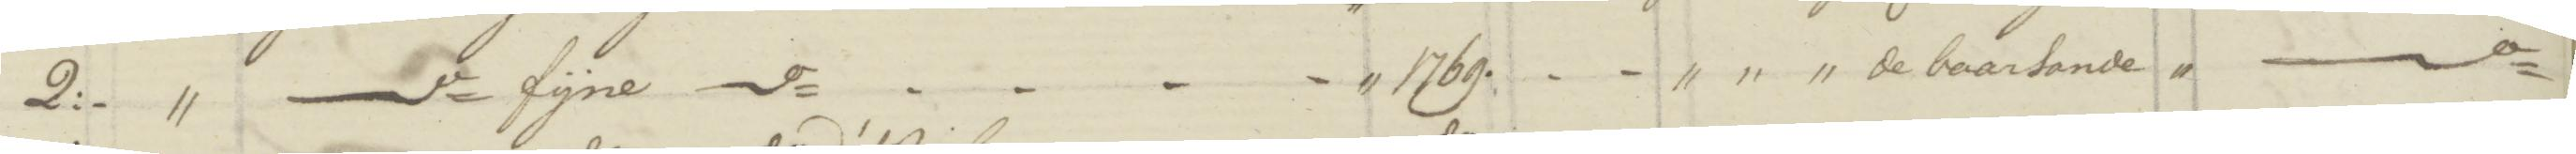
2:- „ _=o fijne _=o - - - - „1769: - - „ „ „ de baarsande „ _=o
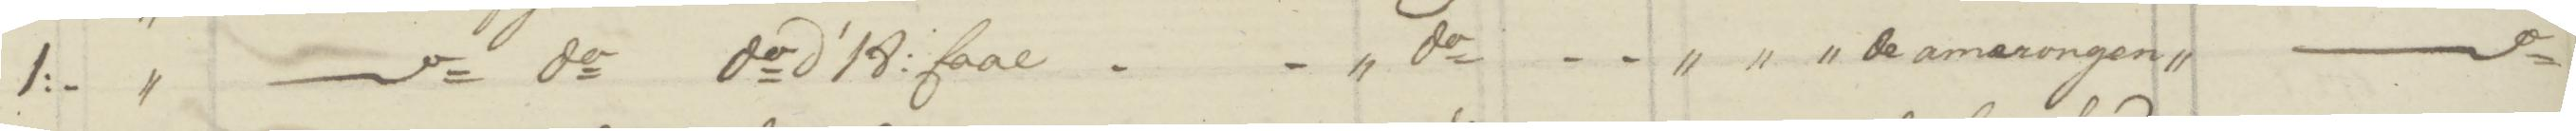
1:- „ _=o d=o d=o d' 18: caal - - „ d=o - - „ „ „ de amerongen „ _=o
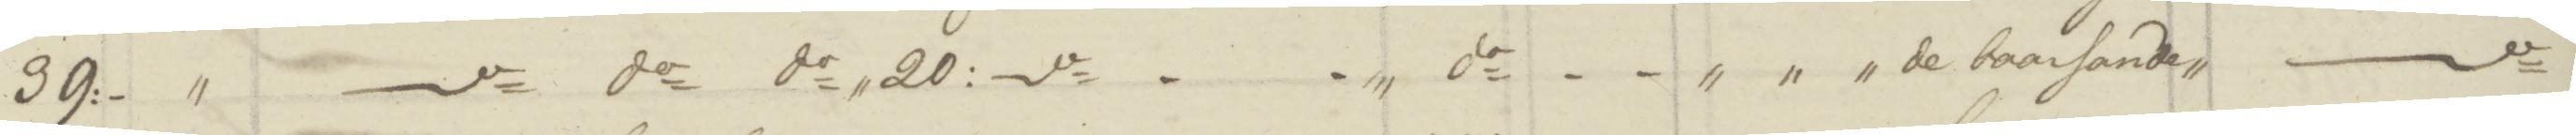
39:- „ d=o. d=o d=o „ 20: d=o - - „ d=o - - „ „ „ de baarsande „ _=o
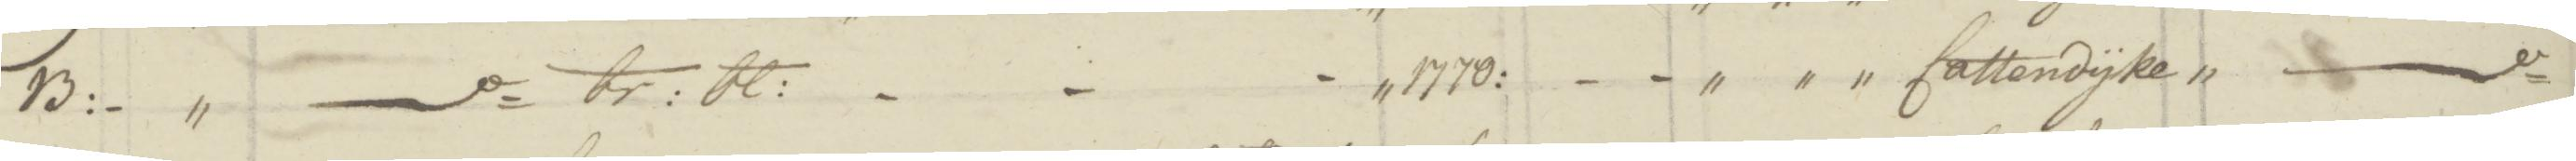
13:- „ _=o br: bl: - - - „1770: - - „ „ „ Cattendijke „ _=o
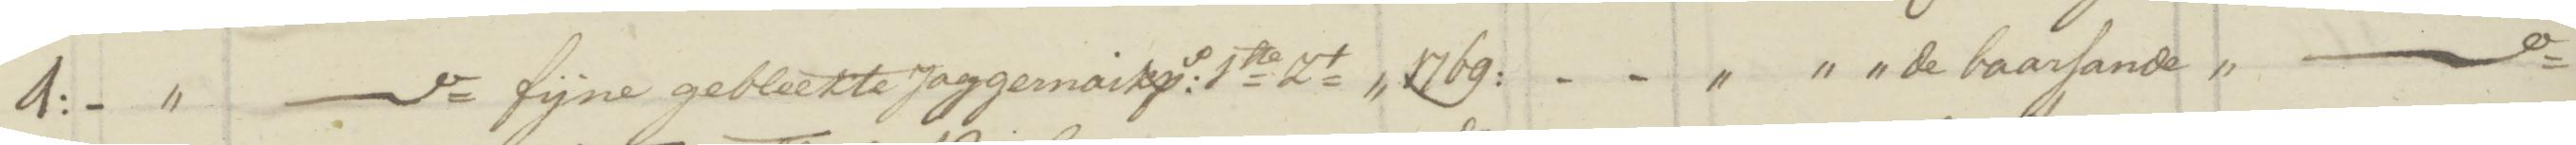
4:- „ _„o fijne gebleekte Jaggernaikp:s 1=ste z=t „1769: - - „ „ „ de baarsande „ _=o
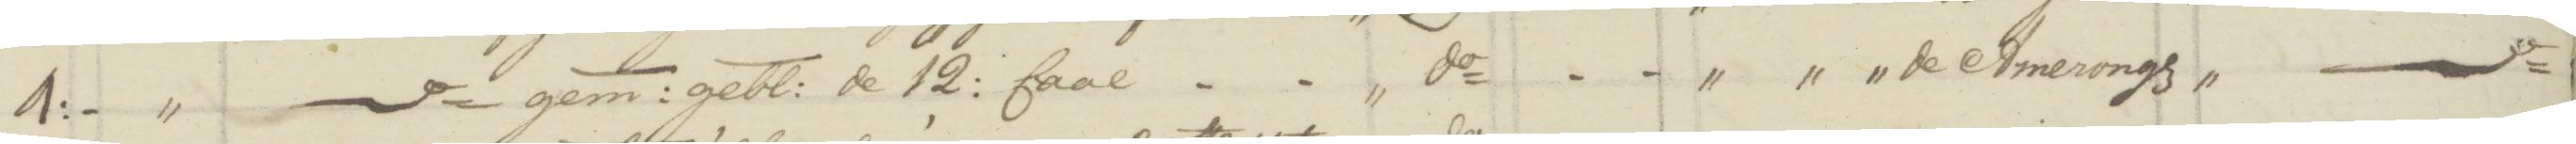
4:- „ _„o gem: gebl: de 12: caal - - „ d=o - - „ „ „ de Amerongen „ _=o
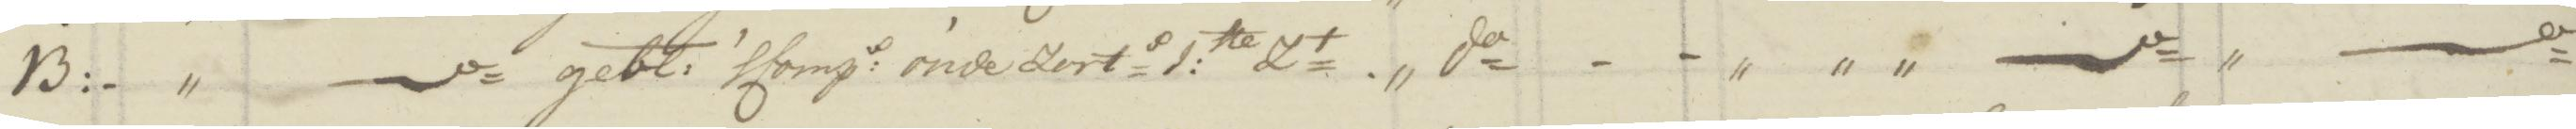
13:- „ _„o gebl: 'sComp:s oude zort=s 1:ste z=t - .„ d=o - - „ „ „ _=o „ _=o
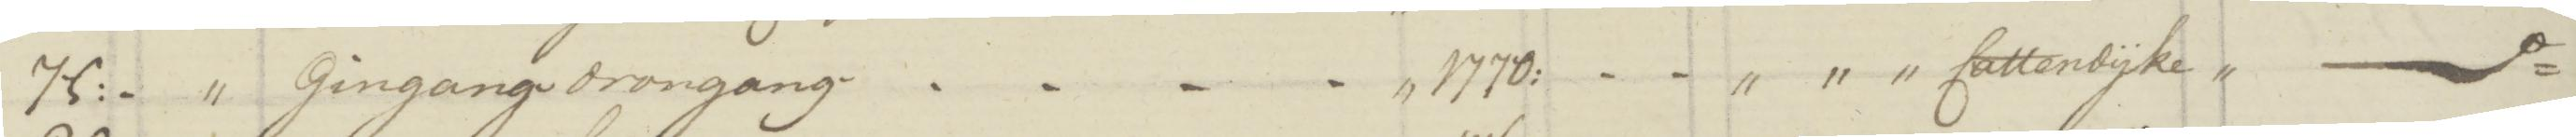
75:- „ Gingang drongang - - - - „ 1770: - - „ „ „ Cattendijke „ _=o
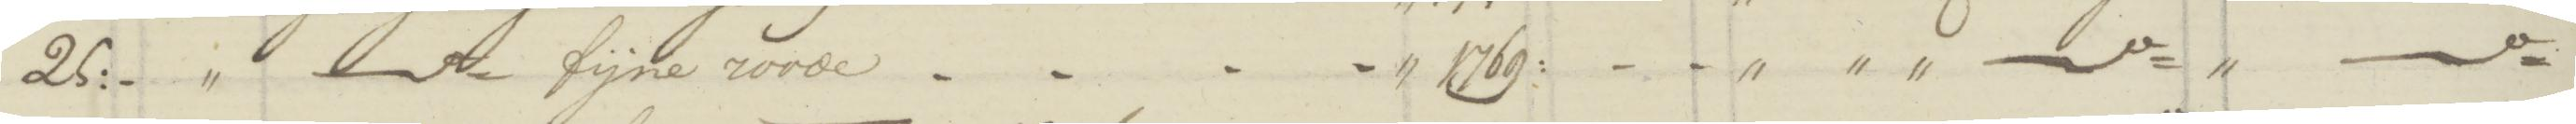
25:- _=o fijne roode - - - - „ 1769: - - „ „ „ _=o „ _=o
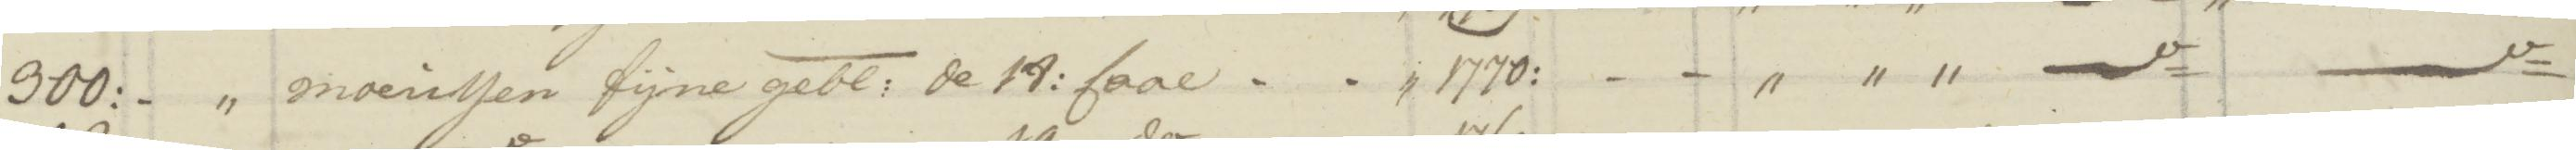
300:- „ moerissen fijne gebl: de 18: caal - - „ 1770: - - „ „ „ _=o _=o
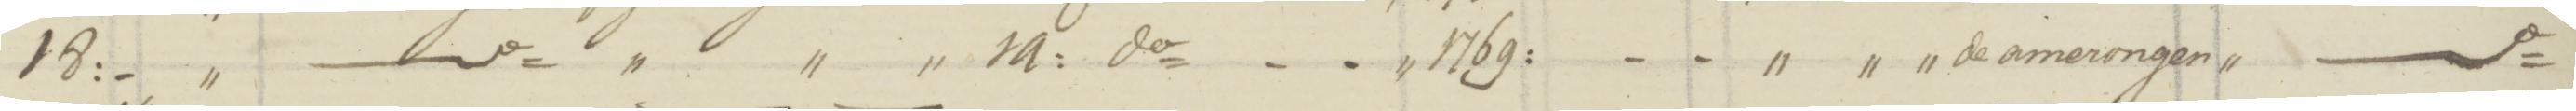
18:- „ _=o „ „ „ 14: d=o - - „ 1769: - - „ „ „ de amerongen „ _=o
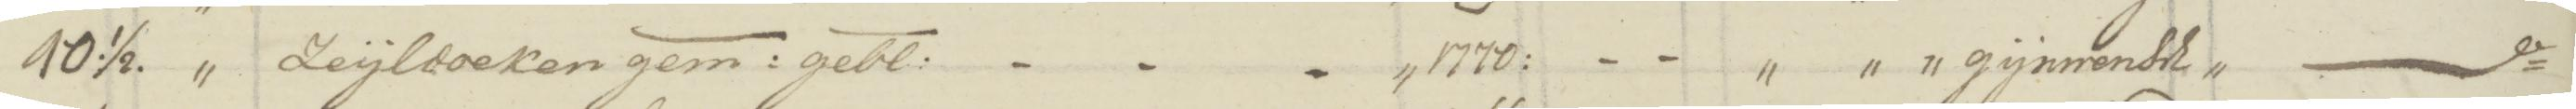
40.½. „ zeijldoeken gem: gebl: - - - „ 1770: - - „ „ „ gijnwensch „ _=o
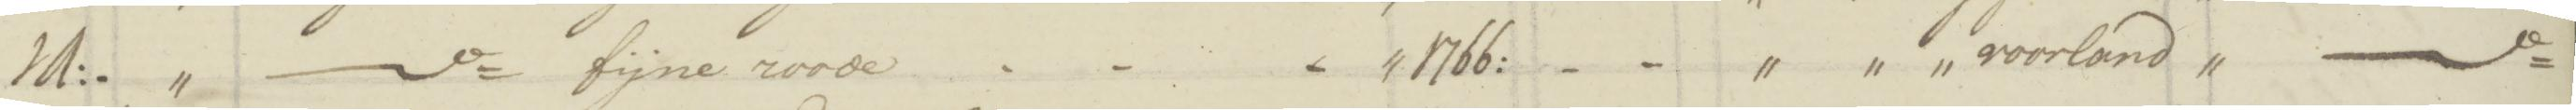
14:- „ _=o fijne roode - - - „ 1766: - - „ „ „ voorland „ _=o
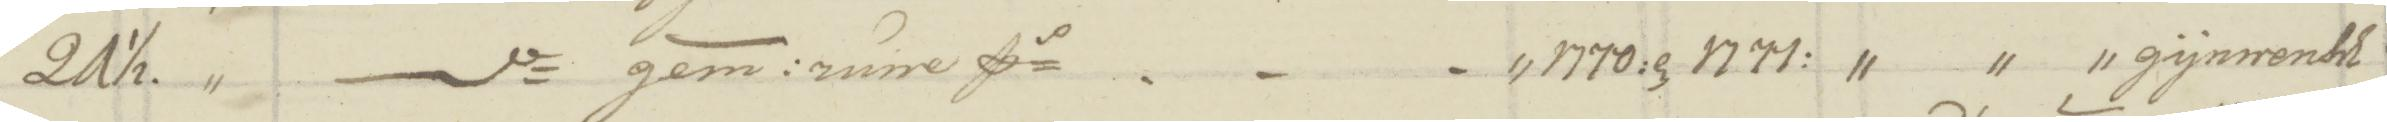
24½. „ _=o gem: ruwe p=s - - - „ 1770:en 1771: „ „ „ gijnwensch
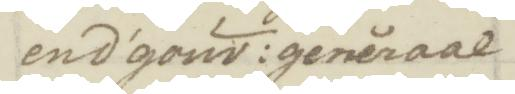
en d’gouv: generaal
